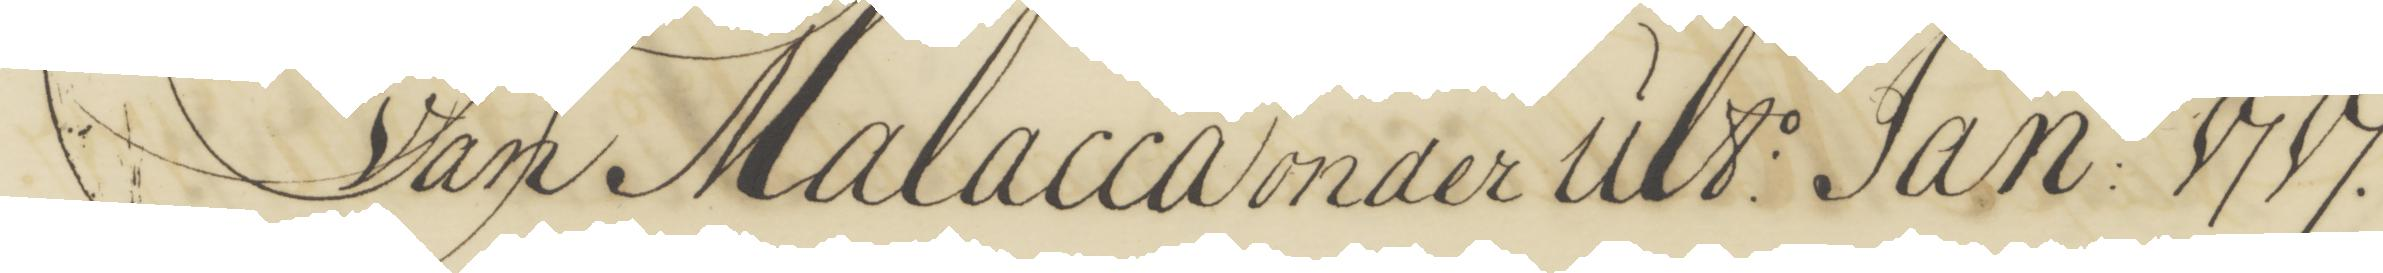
Van Malacca onder ult:o Ian:r 1717.
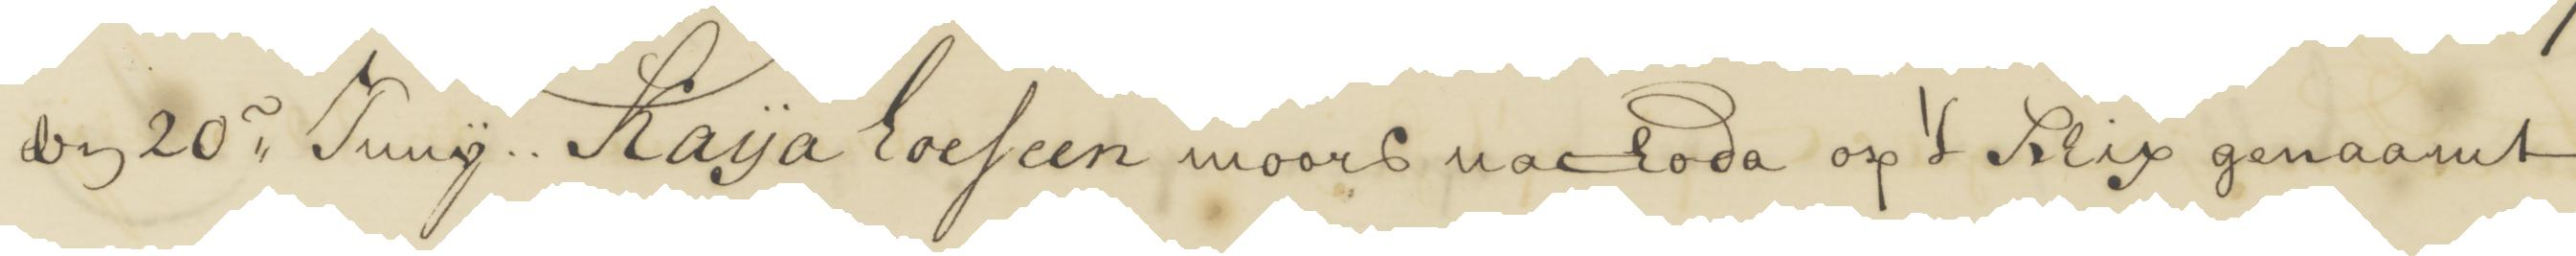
den 20„e Iunij .. Kaija hoeseen moors nachoda op ’t schip genaamt
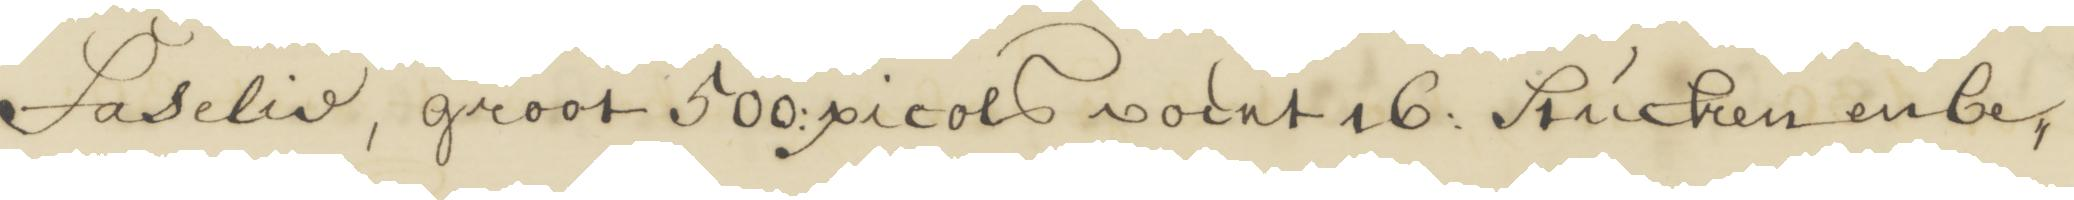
Faselie, groot 500: picols voert 16: stucken en be„
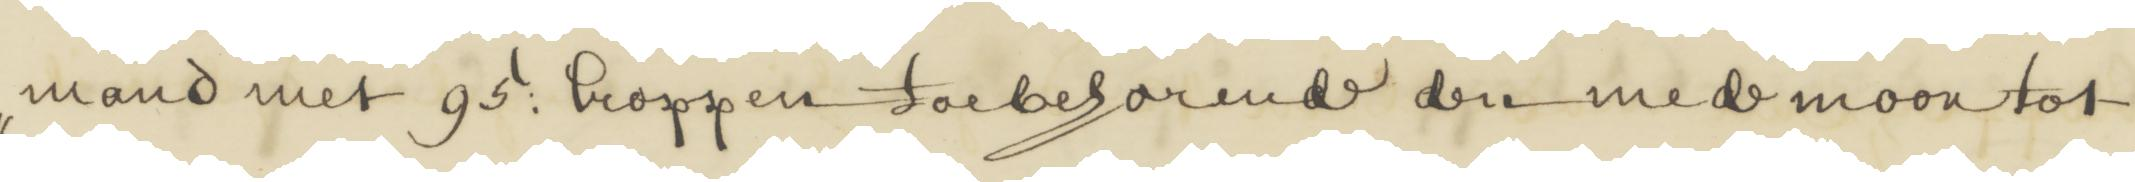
„mand met 95: koppen toebehorende den mede moor tot
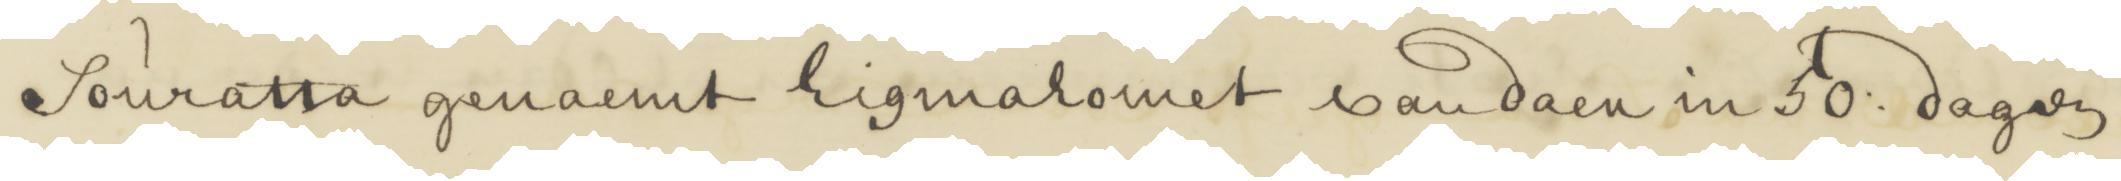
Souratta genaemt higmahomet van daer in 50: dagen
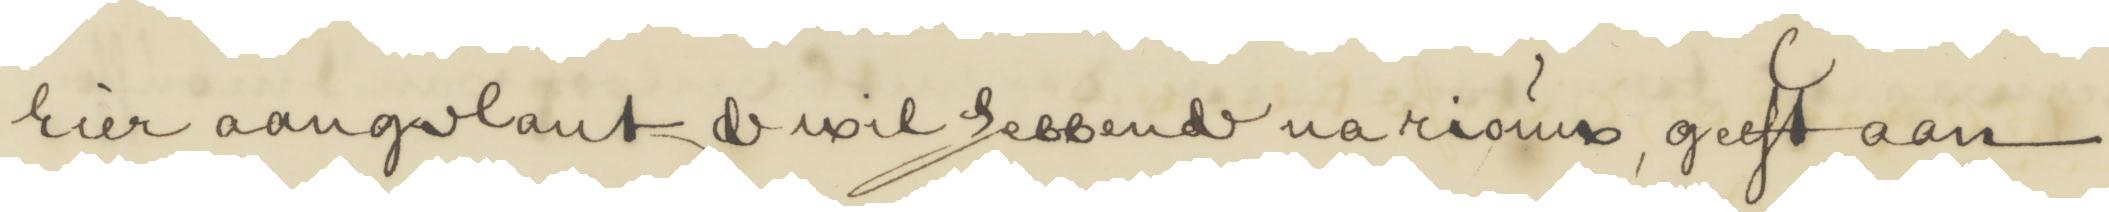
hier aangelant de wil hebbende na riouw, geeft aan
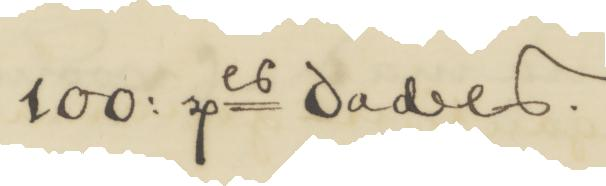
100: p=ls dadels.
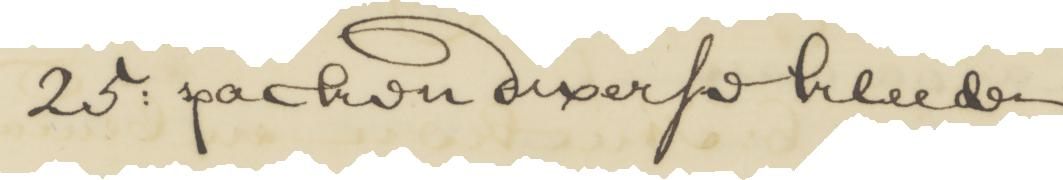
25: packen diverse kleeden
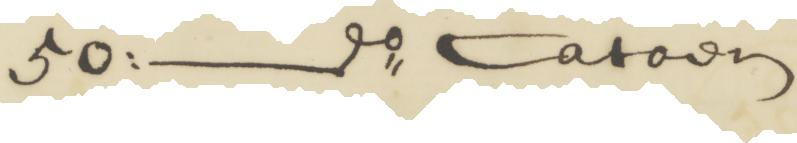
50: d„o Catoen
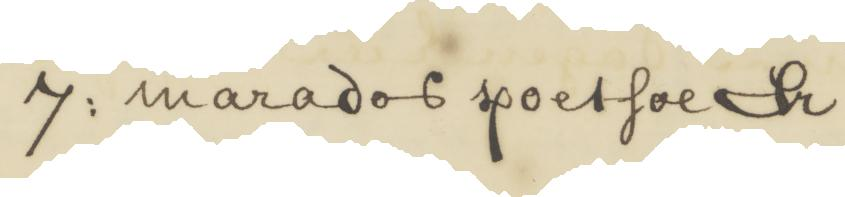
7: marados poetsoeck
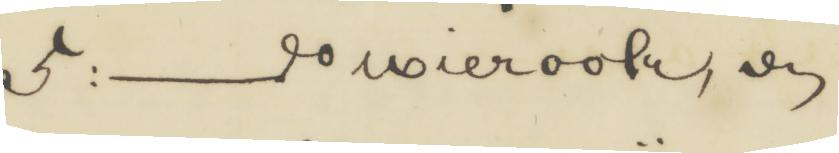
5: do wierook, en
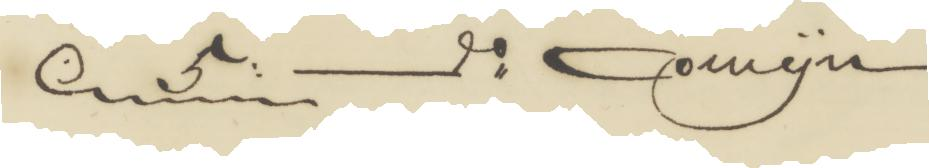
5: d„o Comijn
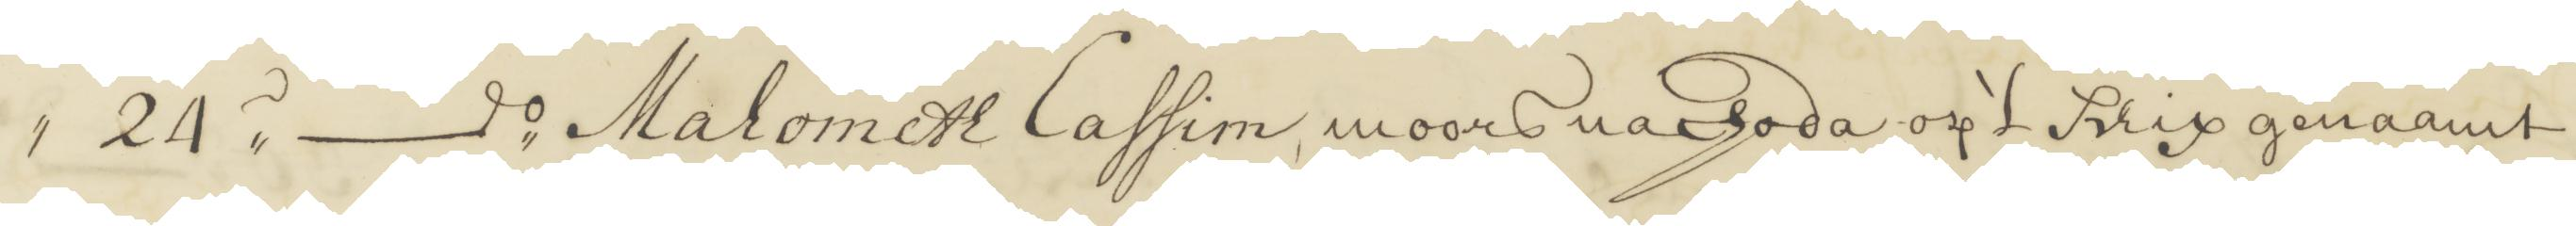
„ 24„e d„o Mahometh Cassim, moors nachoda op ’t schip genaamt
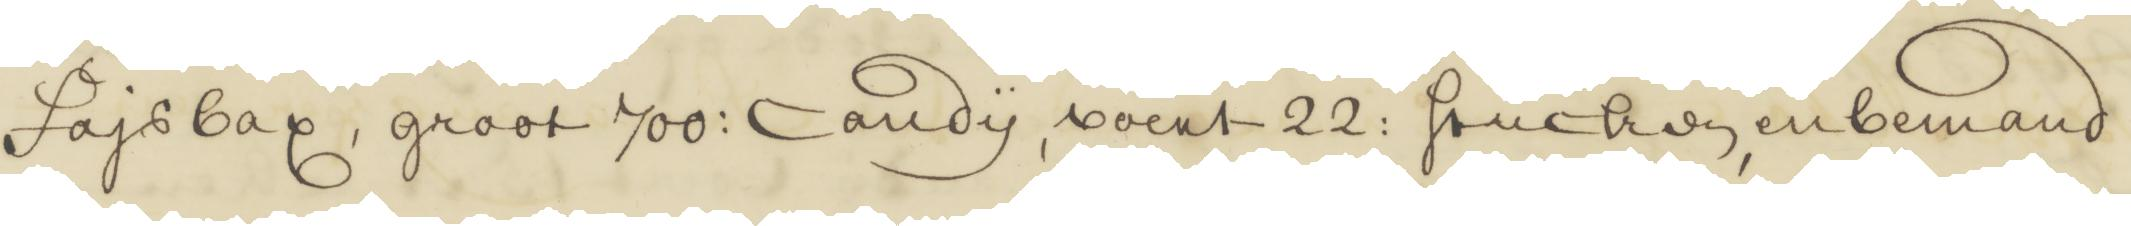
Fajsbax, groot 700: Candij, voert 22: stucken, en bemand
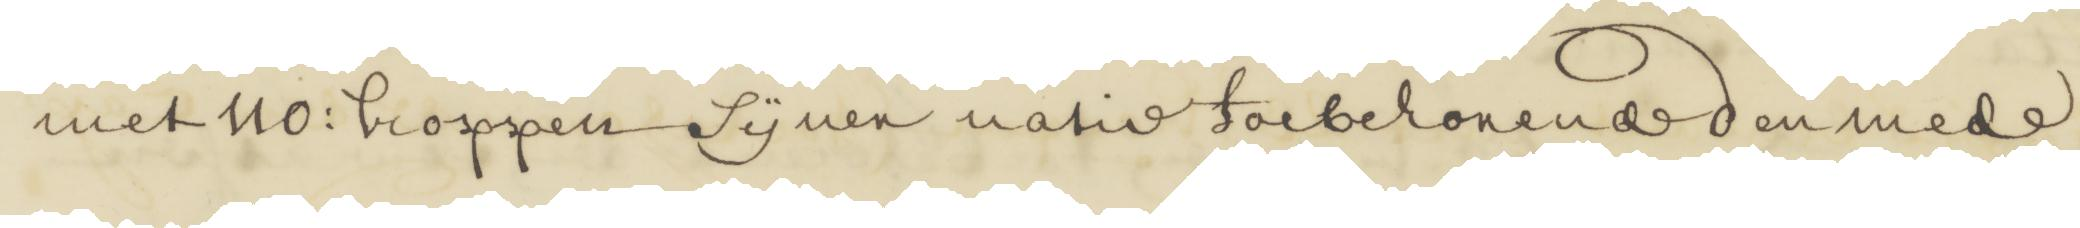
met 110: koppen sijner natie toebehorende den mede
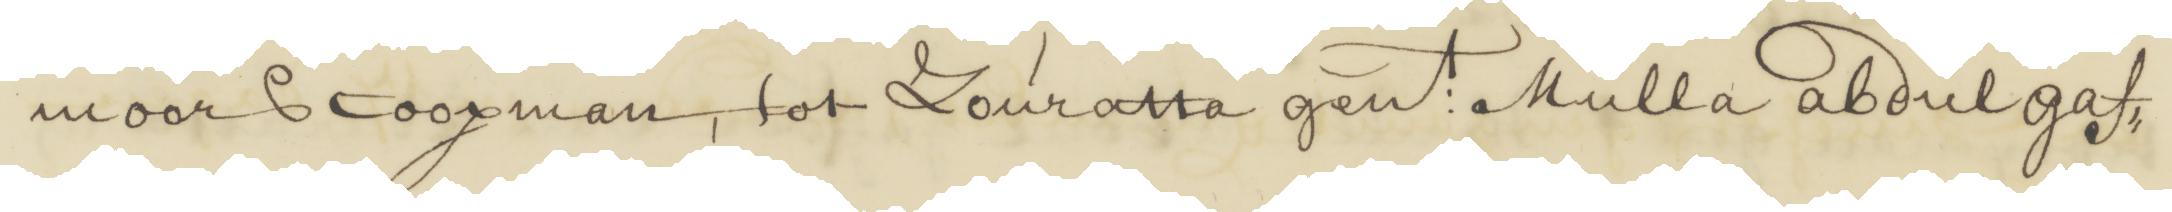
moors coopman, tot Zouratta gen:t Mulla abdul gaf„
